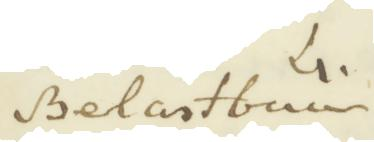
Belastbaar
